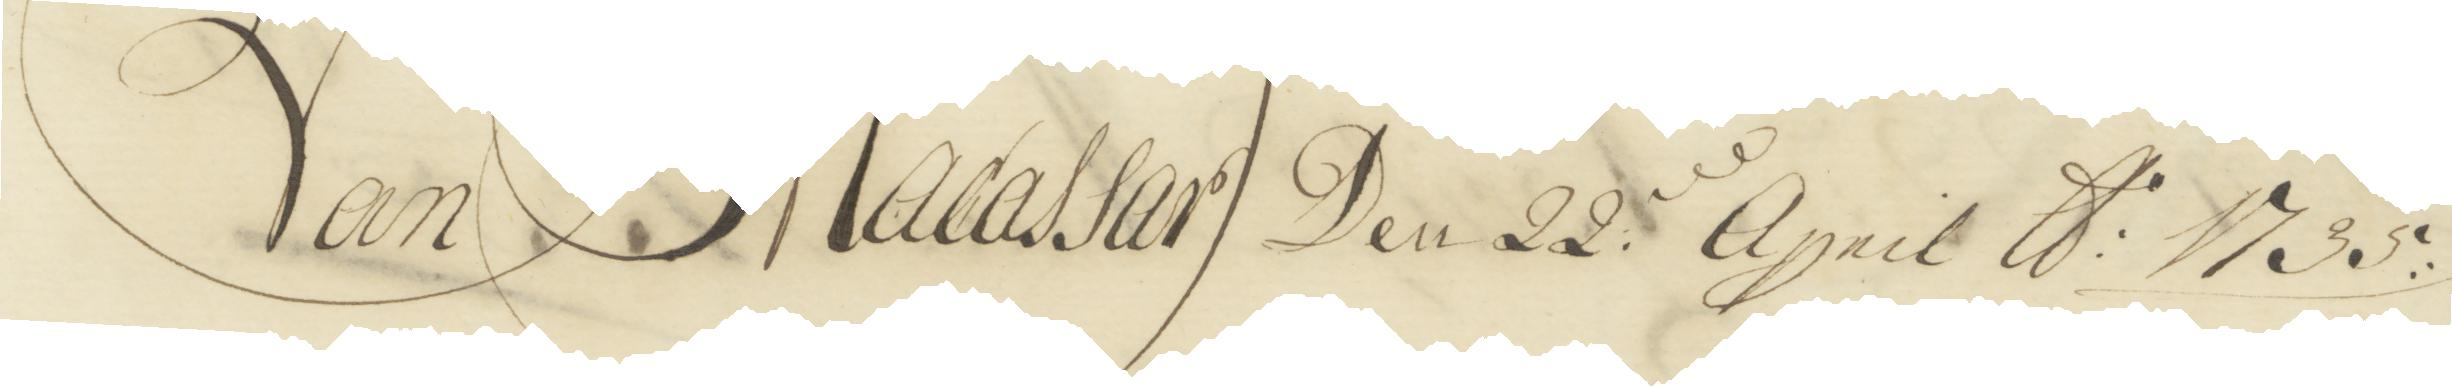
Van Macassar Den 22:' April A:o 1735:
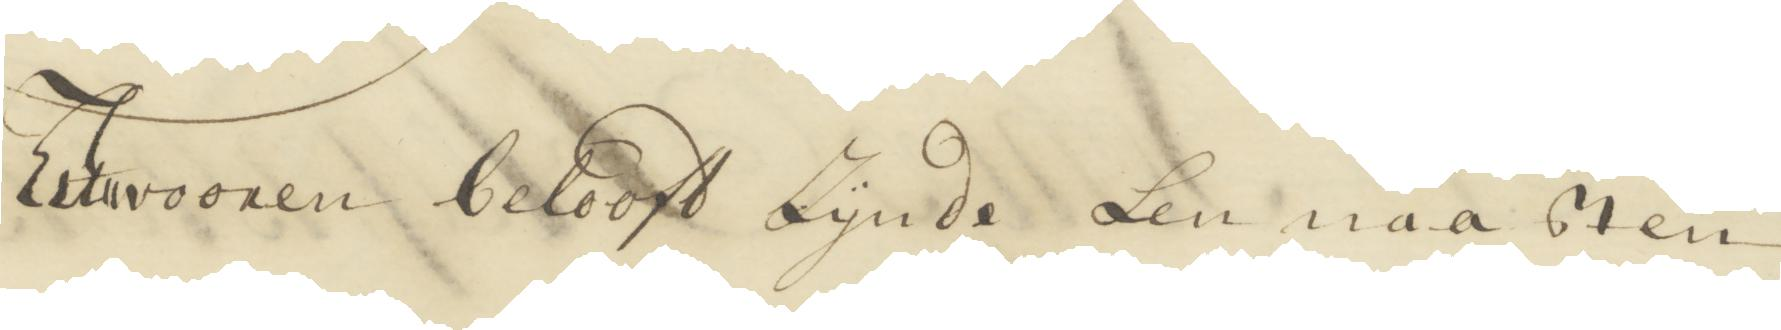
hiervooren belooft zijnde ten naasten
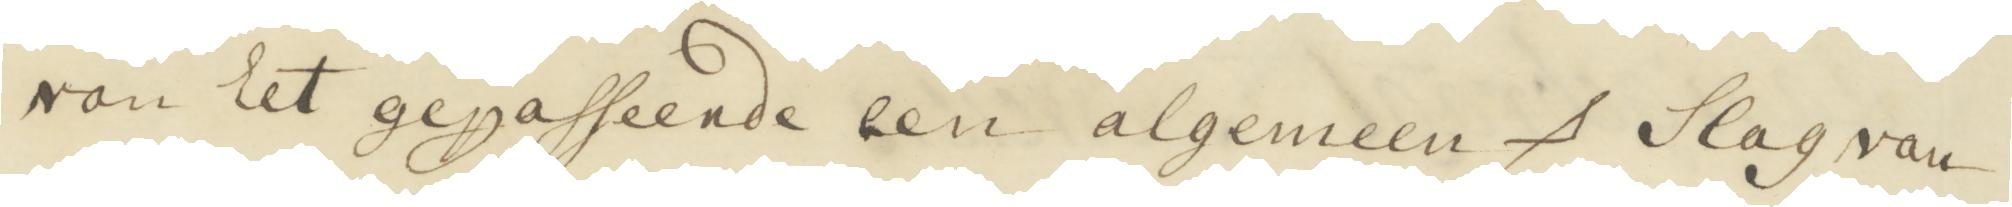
van het gepasseerde een algemeen verslag van
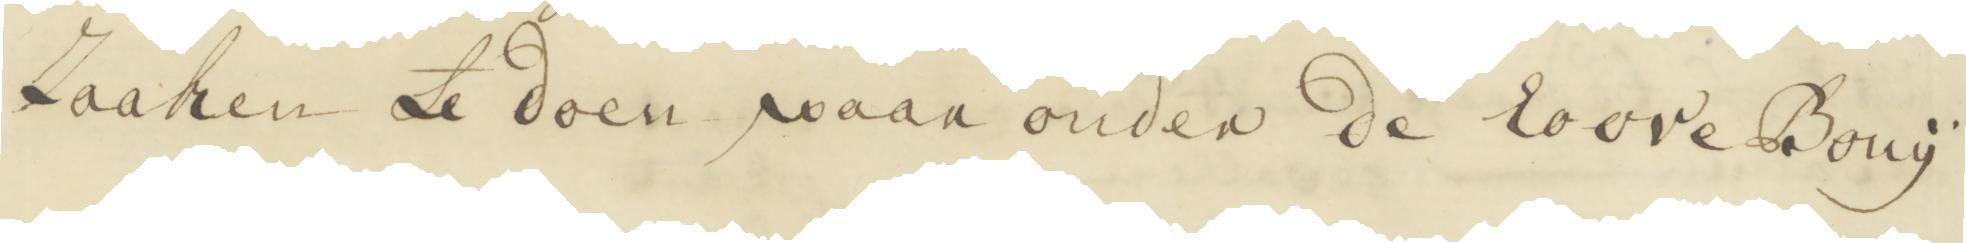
zaaken te doen waar onder de hoove Bonij
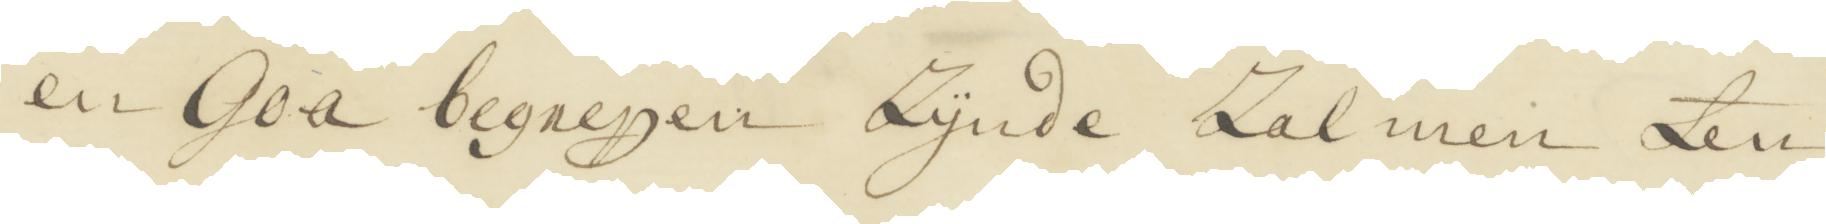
en Goa begrepen zijnde zal men ten
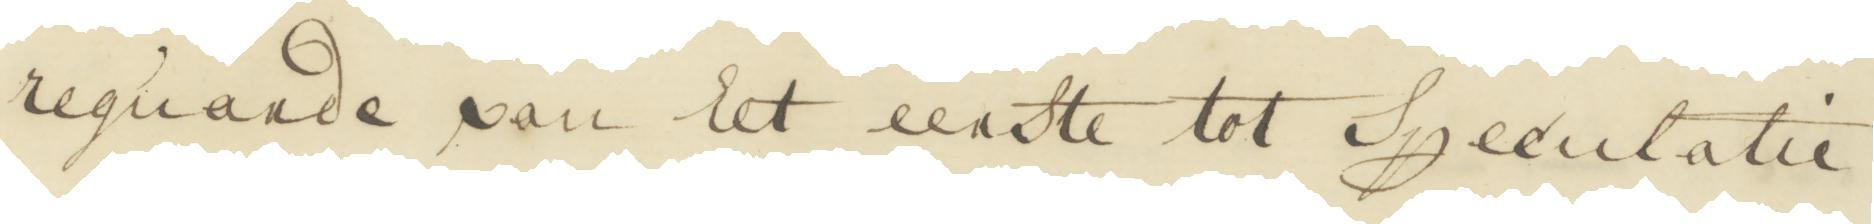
reguarde van het eerste tot speculatie
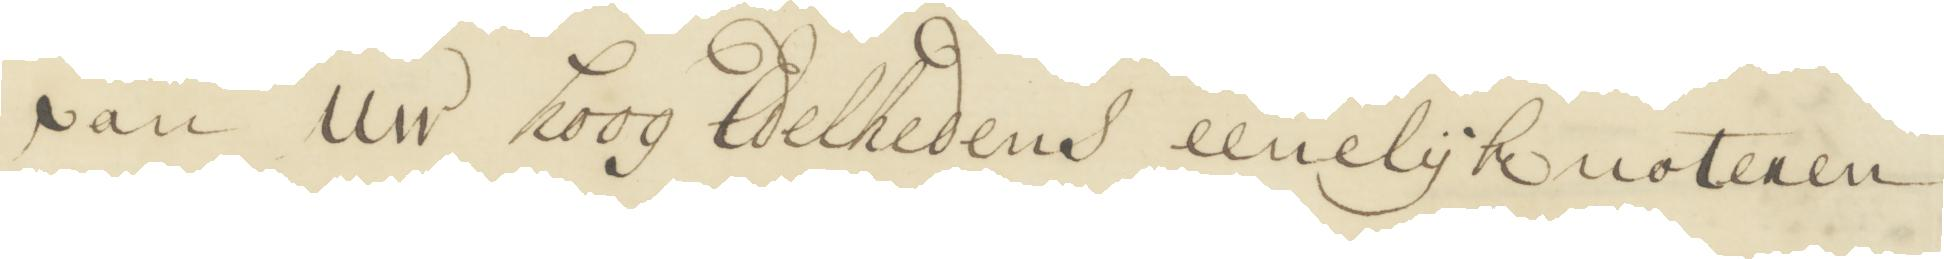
van uw hoog Edelhedens eenelijk noteren
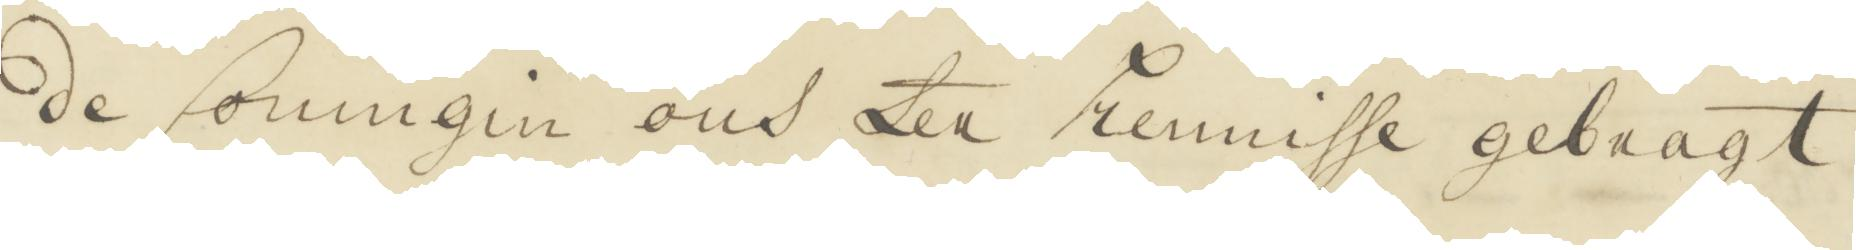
de Coningin ons ter kennisse gebragt
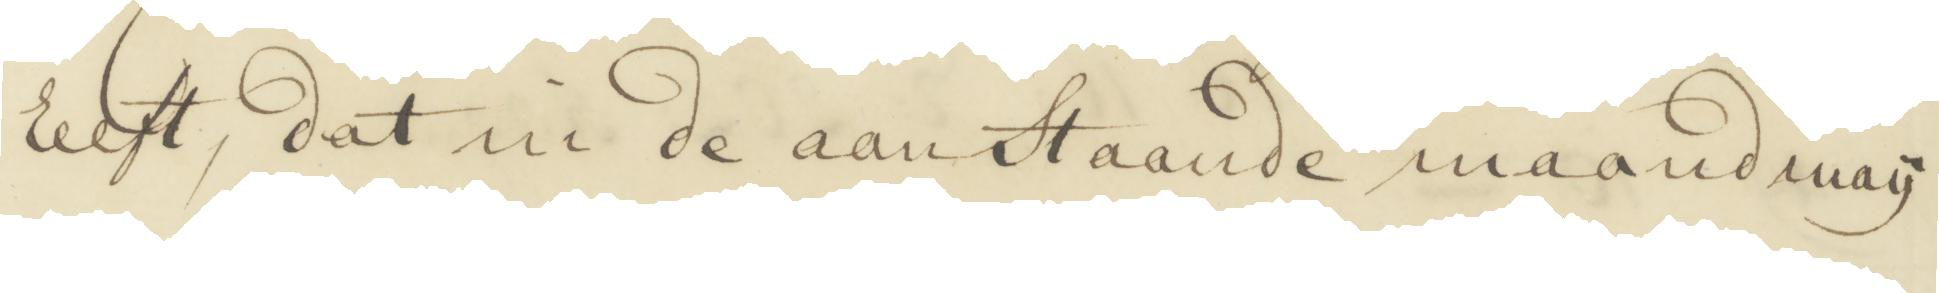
heeft, dat in de aanstaande maand maij
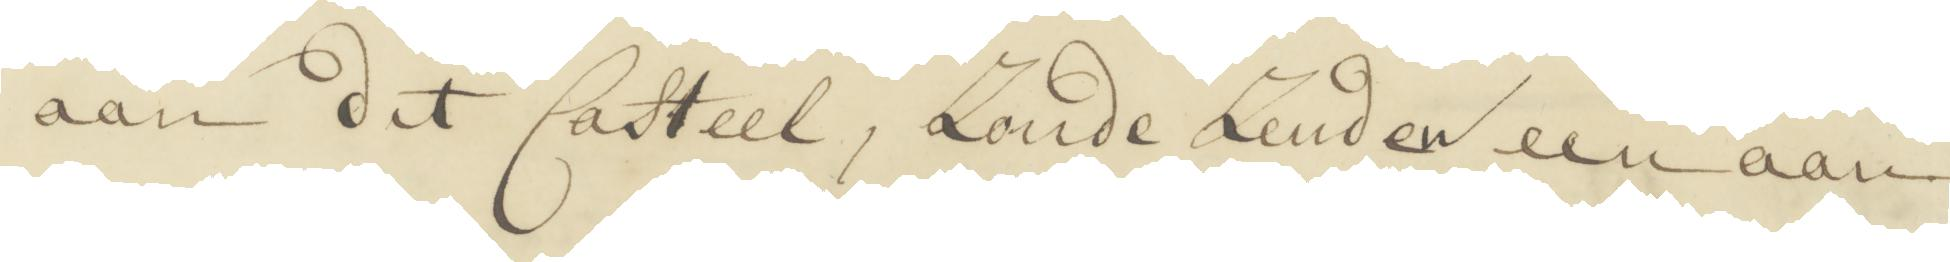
aan dit Casteel, zoude zenden een aan
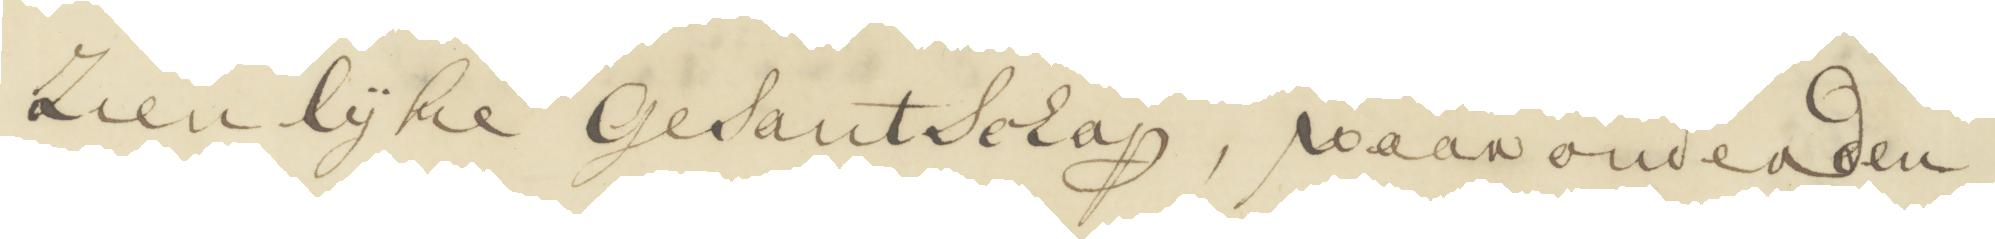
zienlijke gesantschap, waar onder den
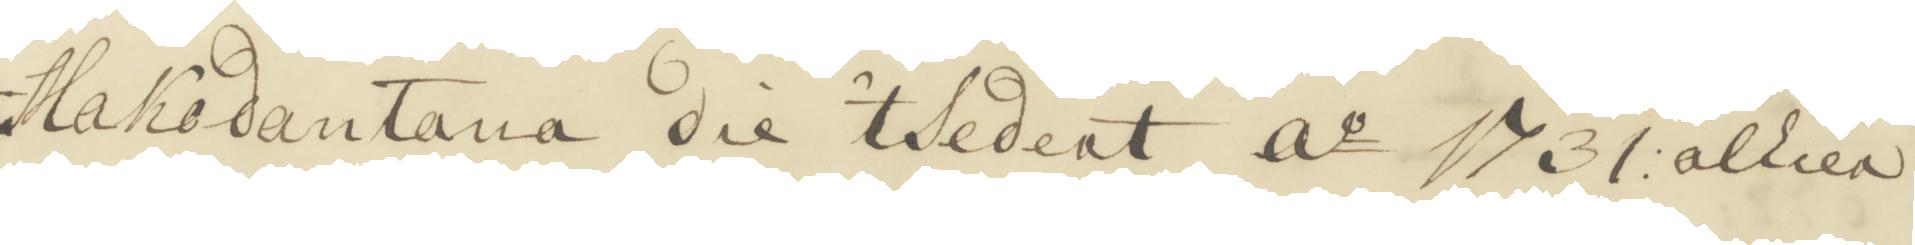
Makodantana die 'tsedert a=o 1731: alhier
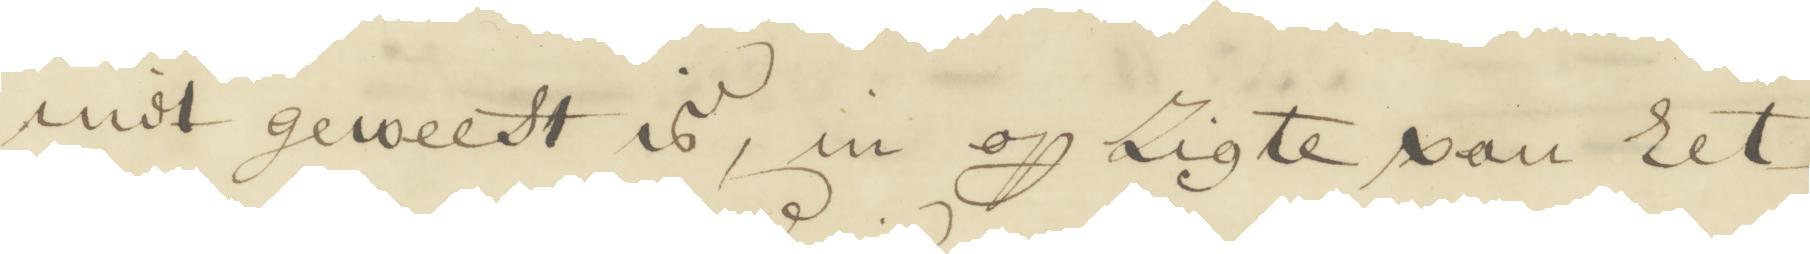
niet geweest is, in op zigte van het
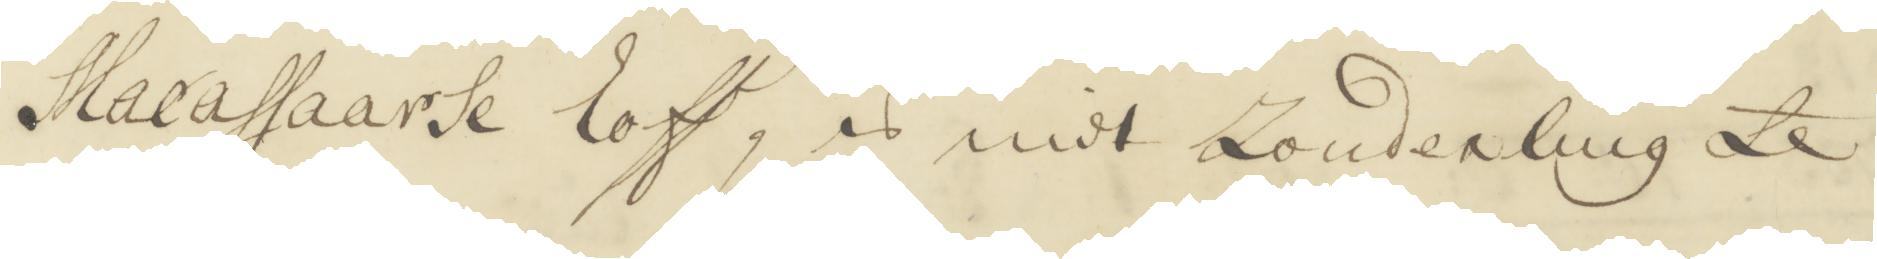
Macassaarse hoff, is niet zonderling te
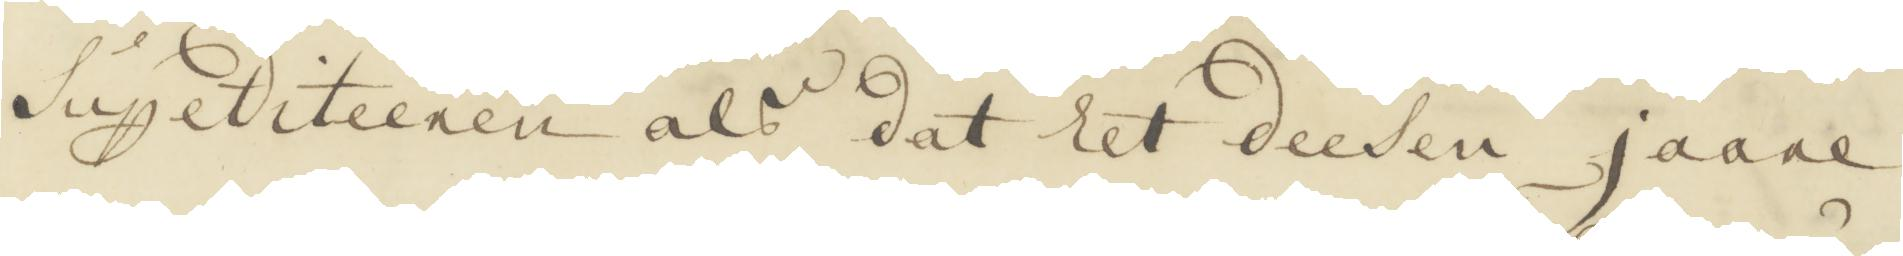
supediteeren als dat het deesen jaare
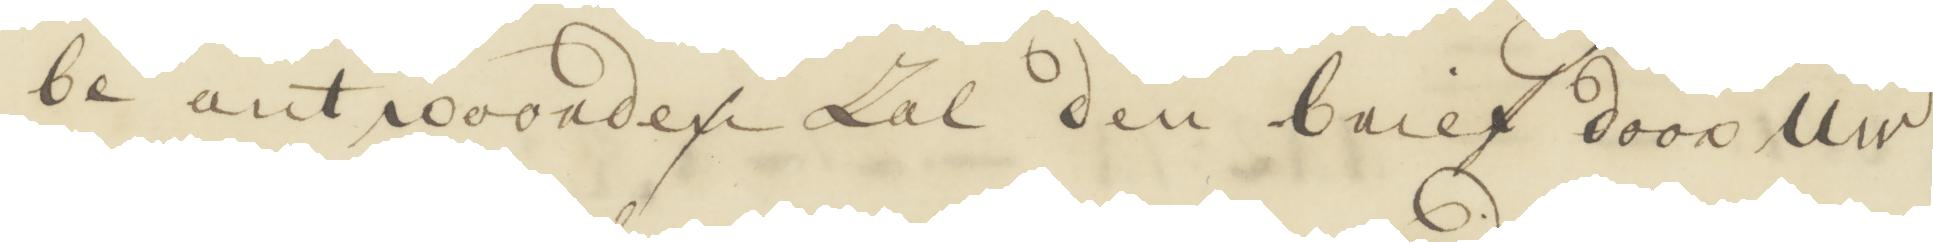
be antwoorden zal den brief door uw
